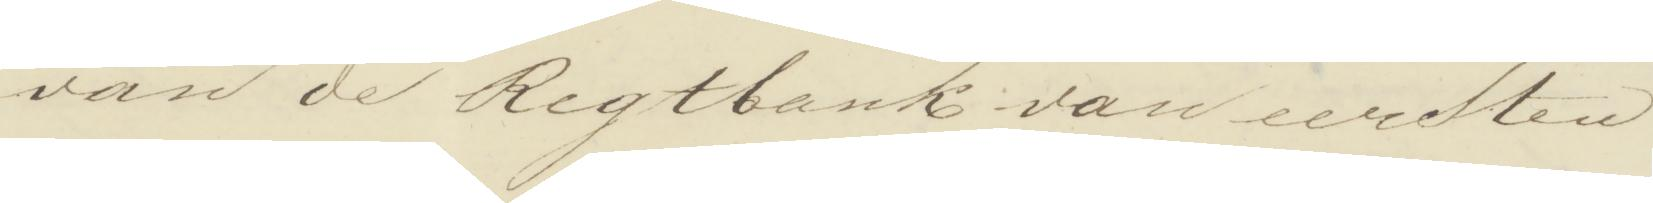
van de Regtbank van eersten
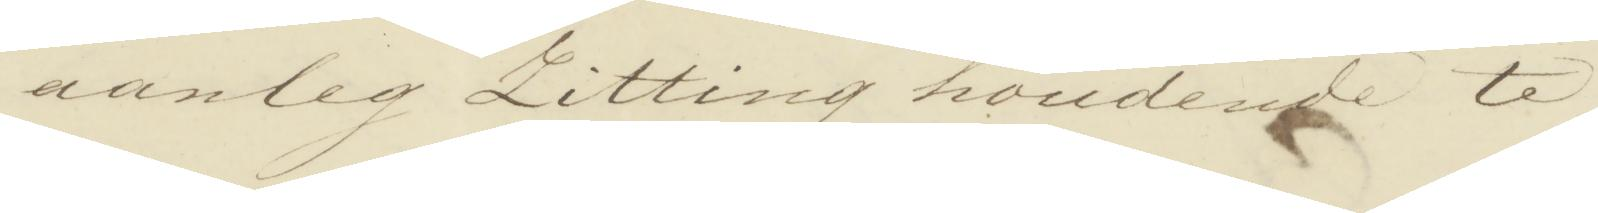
aanleg zitting houdende te
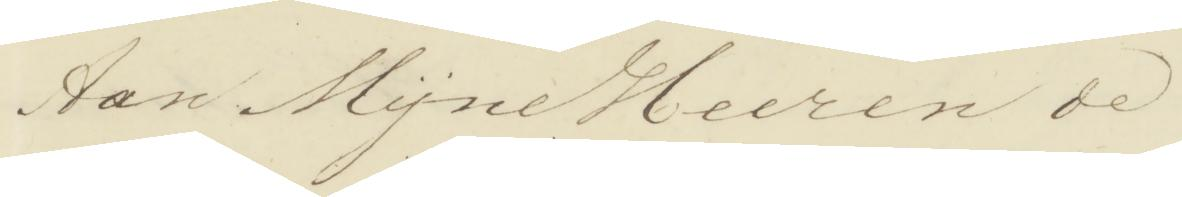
Aan Mijne Heeren de
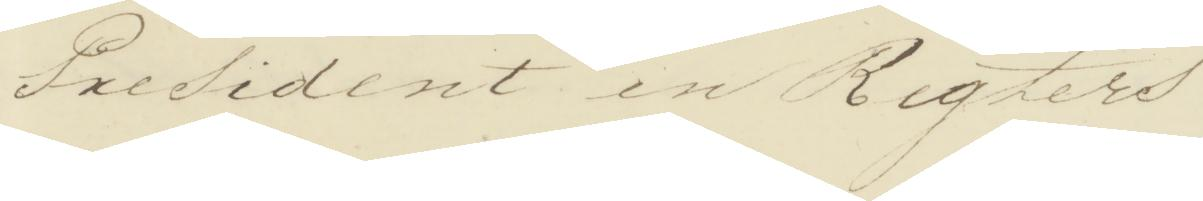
President en Regters
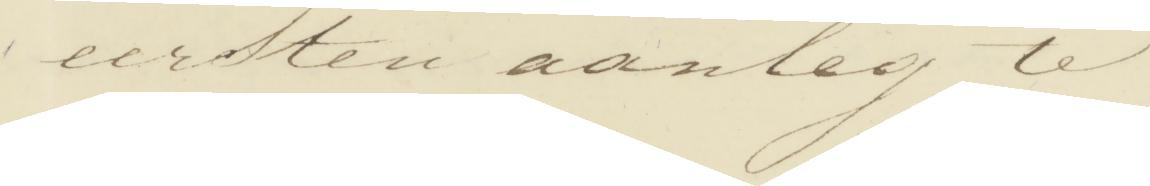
eersten aanleg te
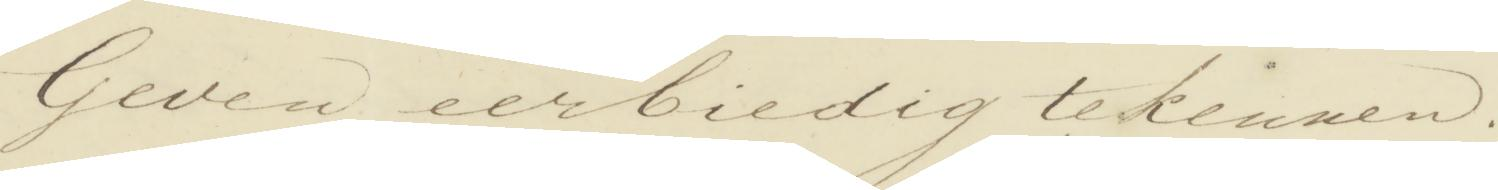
Geven eerbiedig te kennen:
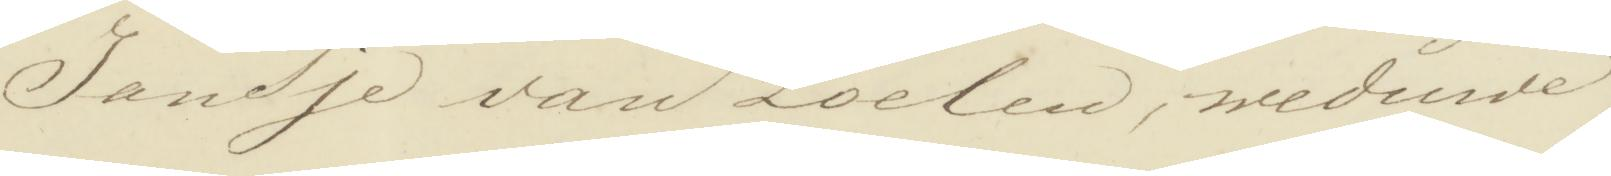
Iansje van Zoelen, weduwe
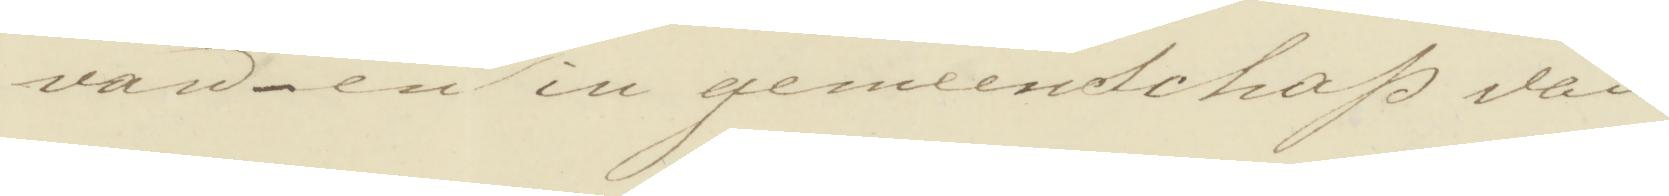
van - en in gemeenschap van
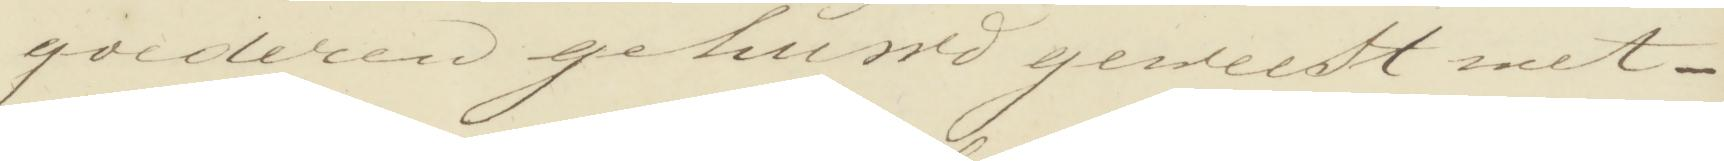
goederen gehuwd geweest met-
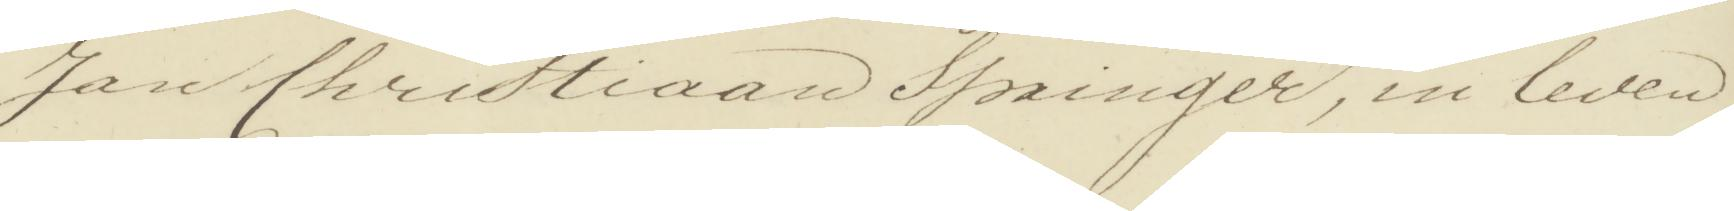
Jan Christiaan Springer, in leven
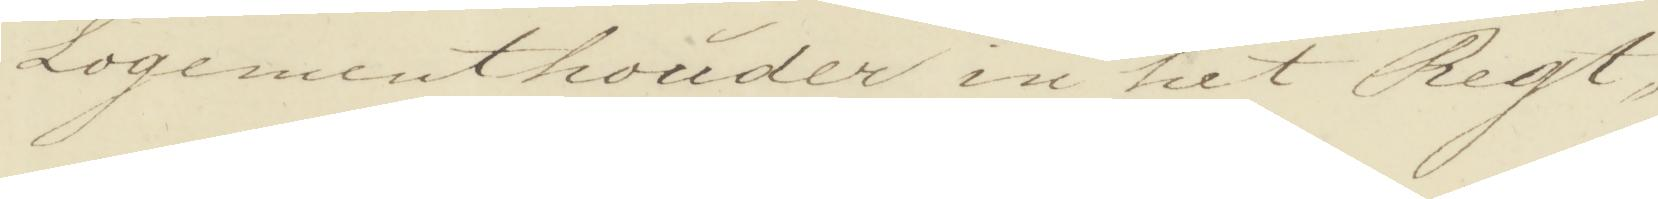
Logementhouder in het Regt„
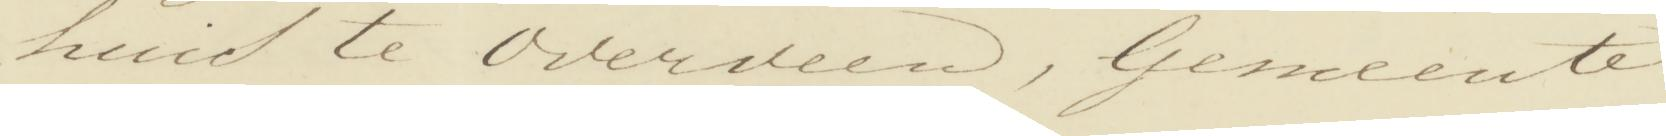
„huis te overveen, Gemeente
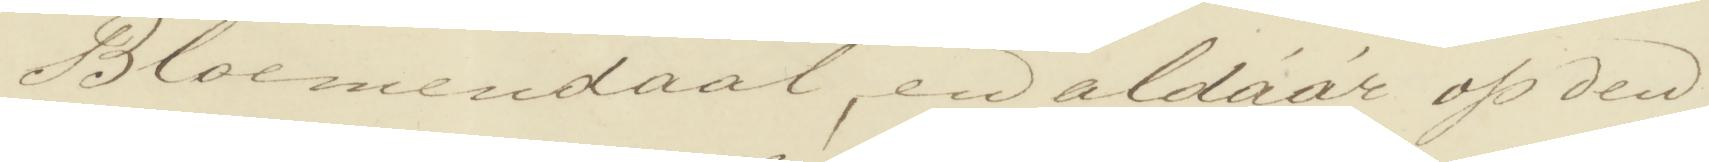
Bloemendaal, en aldáár op den
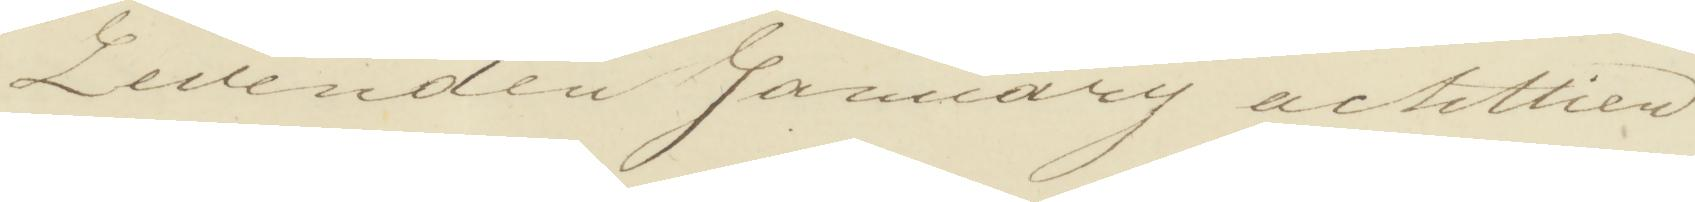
Zevenden January achttien
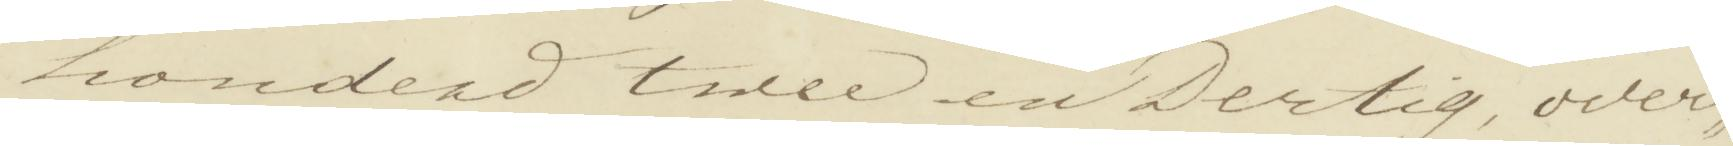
honderd twee en Dertig, over„
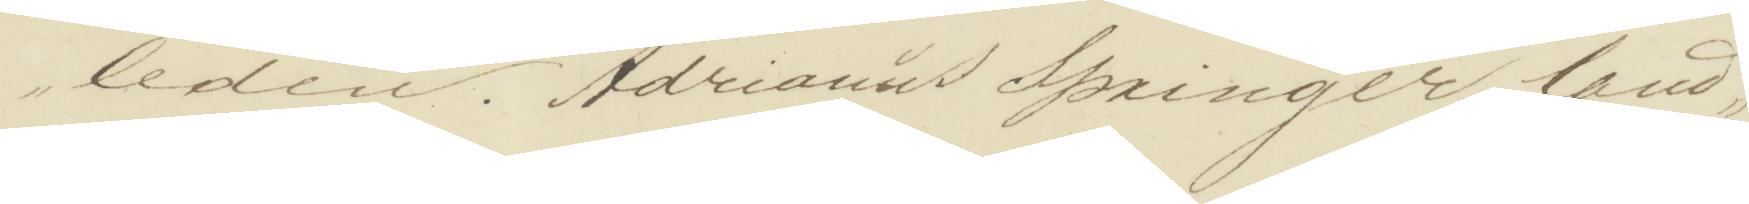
„leden. Adrianus Springer land„
